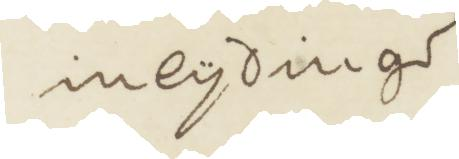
inlijdinge
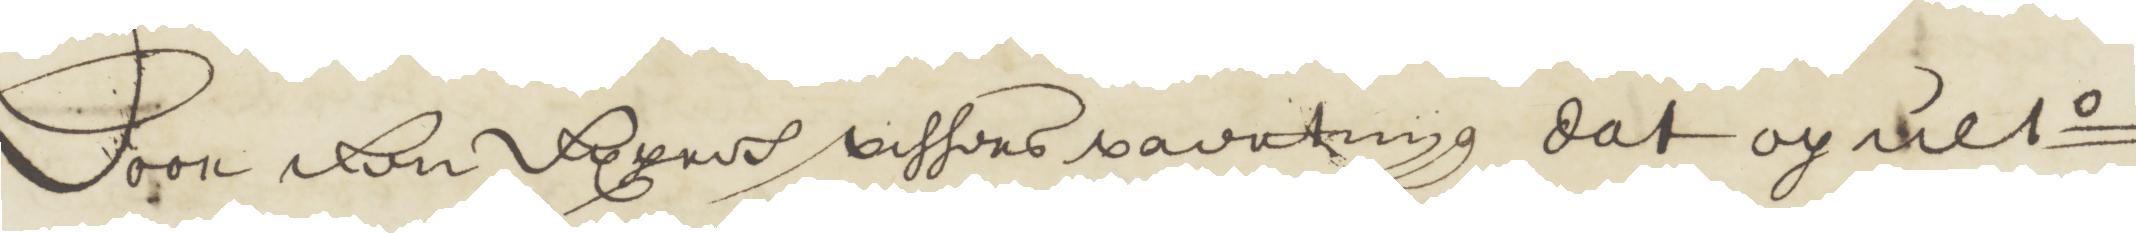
Door Een Expres vissers vaertuijg dat op ult=o
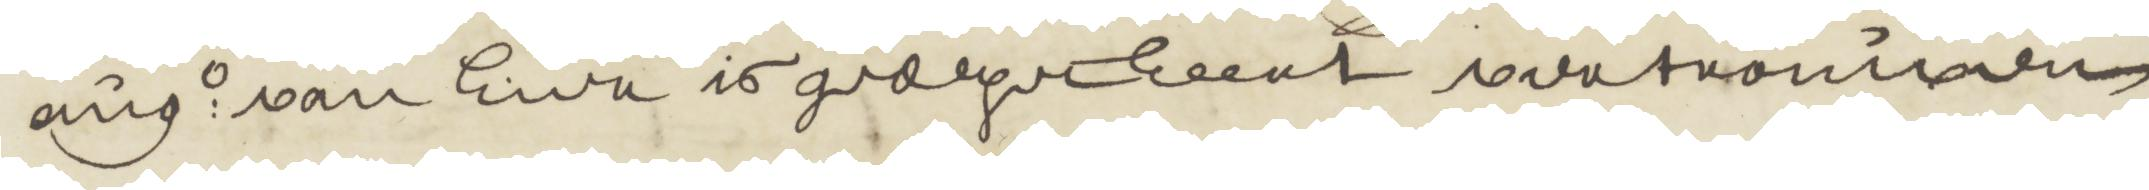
aug:o van hier is gedepecheert vertrouwen
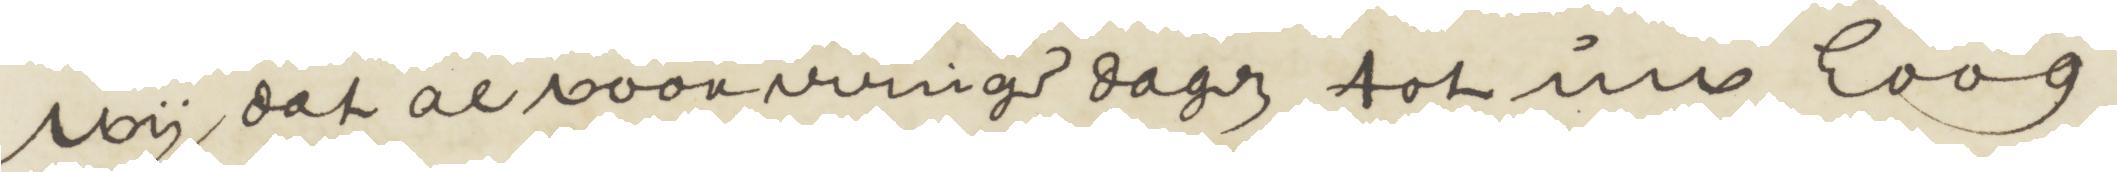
wij dat al voor eenige dagen tot uw hoog
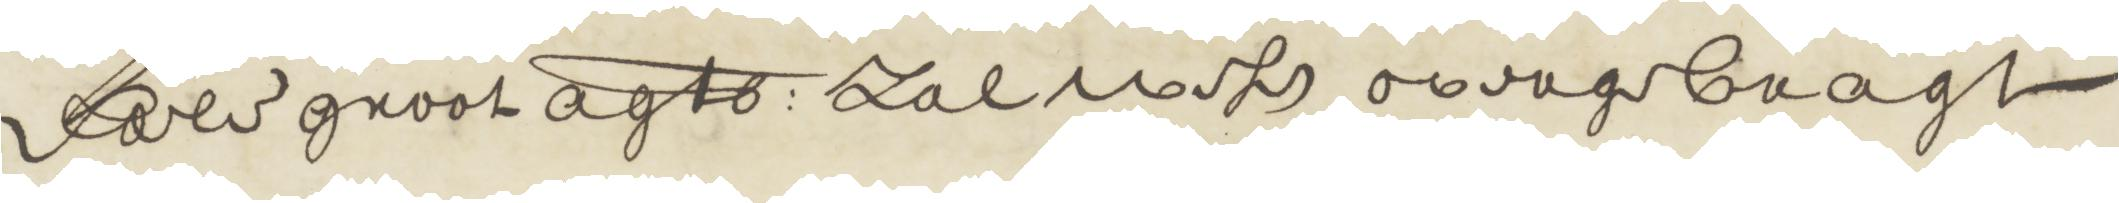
Edele groot agtb: Zal wesen overgebragt
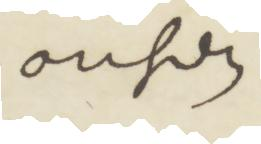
onsen
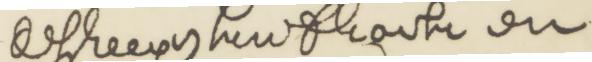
de scheepen kiefhoek en
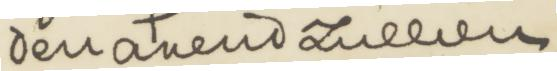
den arend zullen
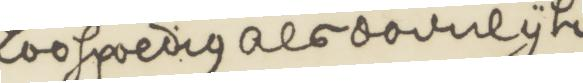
Zoo spoedig als doenlijk
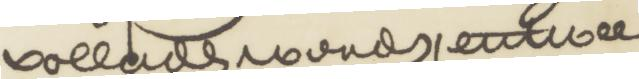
volladen werden, en twee
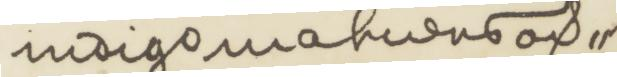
indigomakers over„
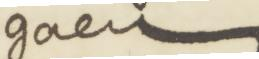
gaen
